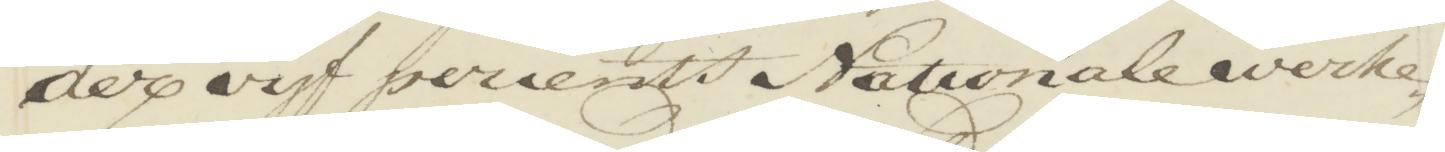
der vyf percents Nationale werke„
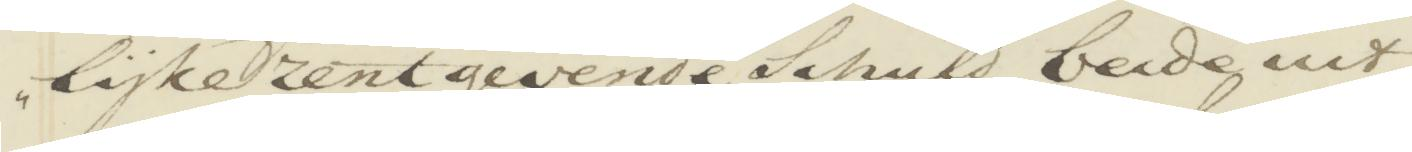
„lijke rentgevende schuld, beide uit
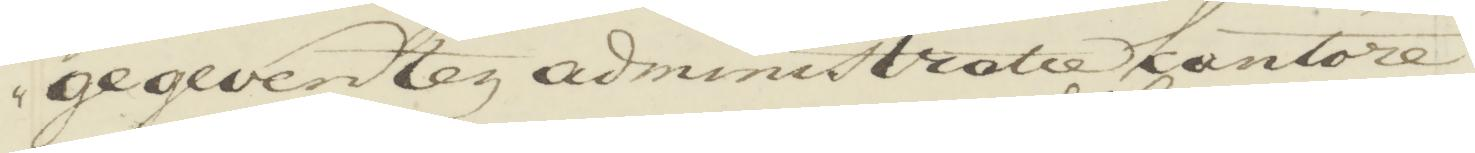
„gegeven ten administratie kantore
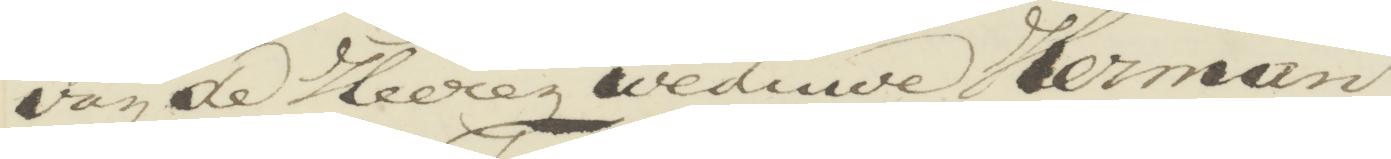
van de Heeren weduwe Herman
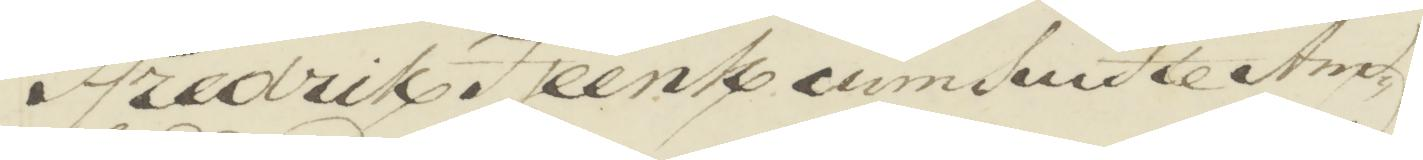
Fredrik Tjeenk cum suis te Am„
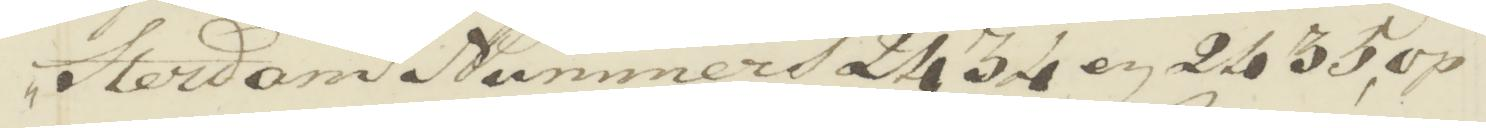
„sterdam Nummers 2434 en 2435, op
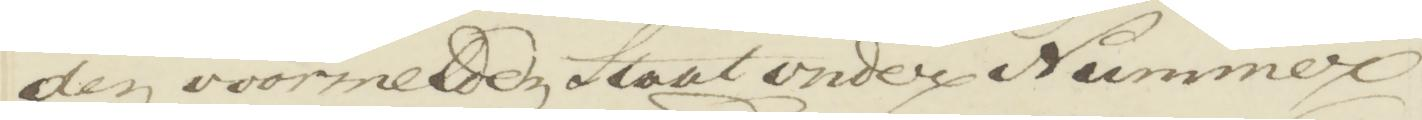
den voormelden Staat onder Nummer
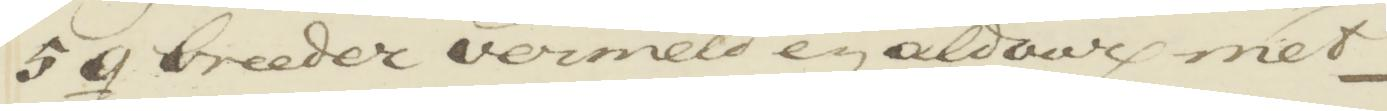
5 g breeder vermeld en aldaar met
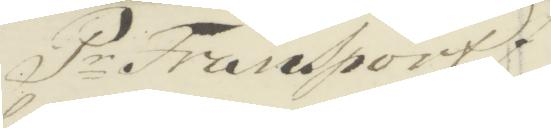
P=r Transport
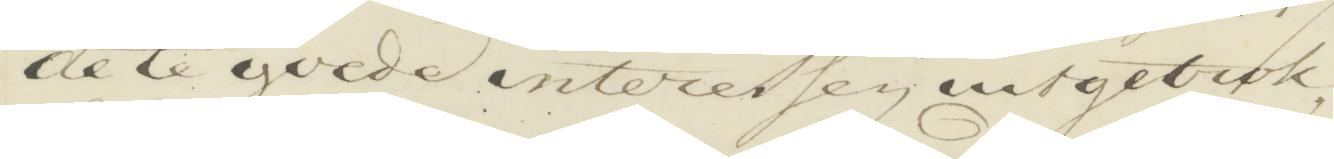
de te goede interessen uitgetrok„
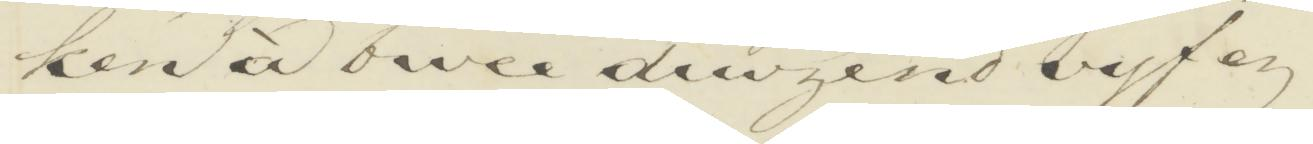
ken à twee duizend vijf en
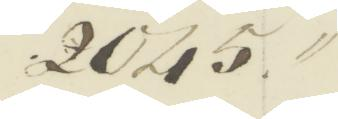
2045. „
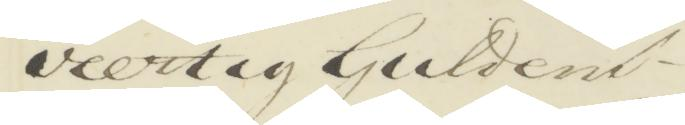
veertig Guldens-
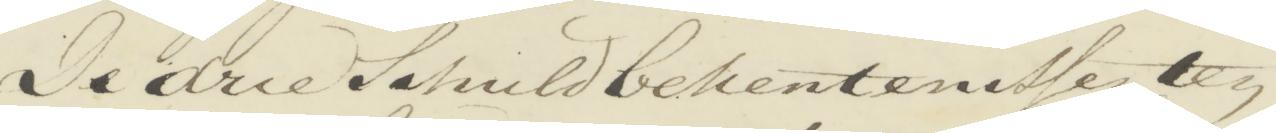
De drie schuldbekentenissen ten
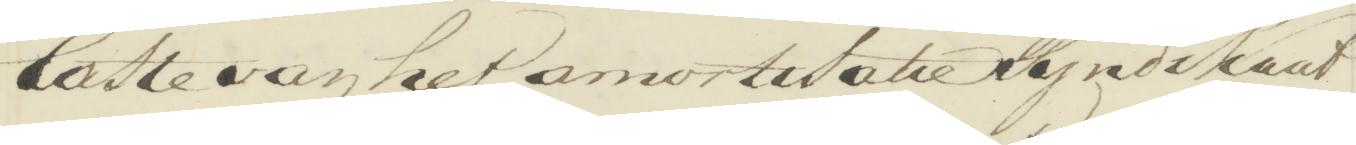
laste van het amortisatie syndikaat
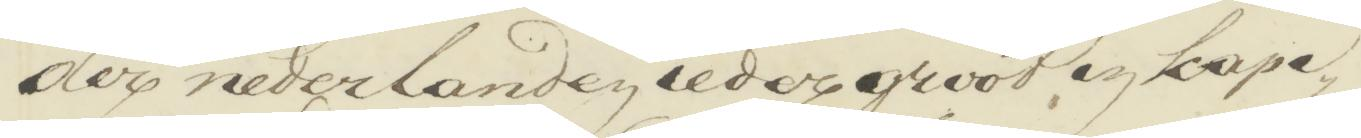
der nederlanden ieder groot in kapi„
